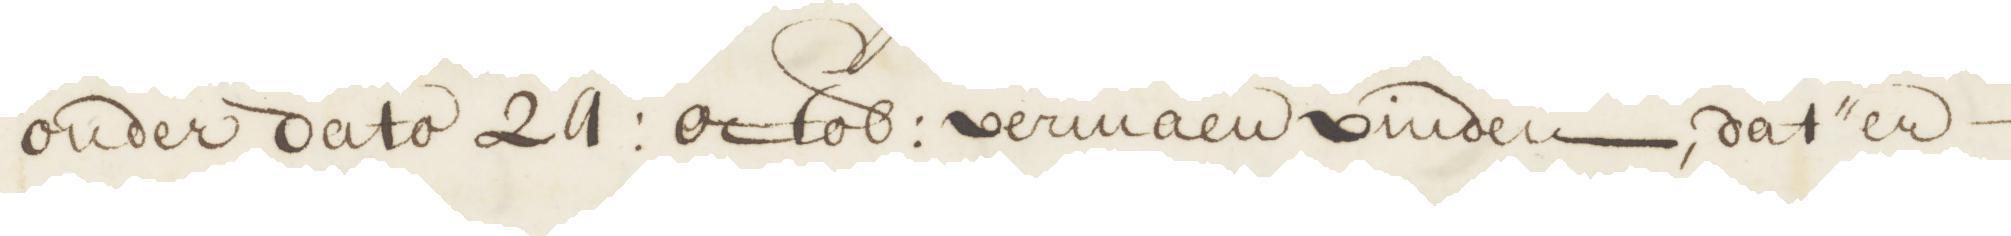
onder dato 24:' octob: vermaen vinden, dat "er-
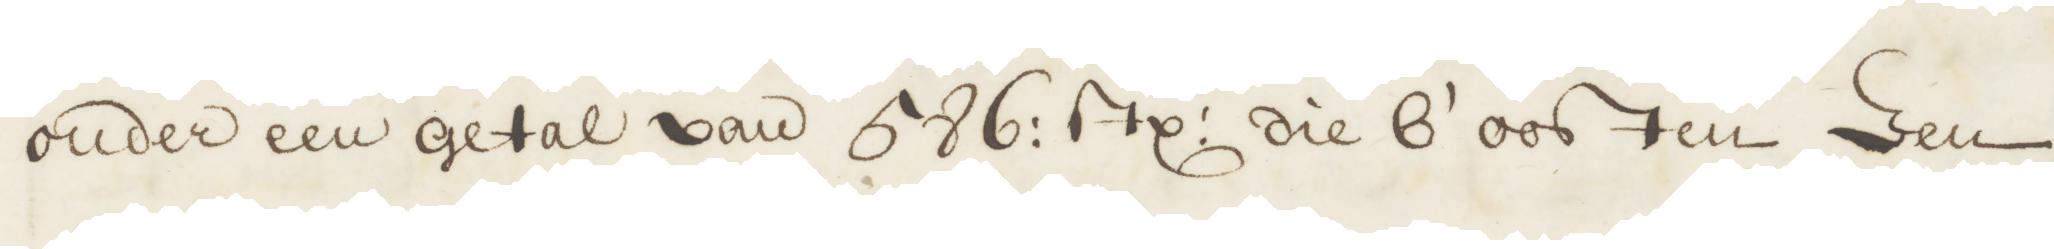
onder een getal van 586: stx: die b' oosten Een
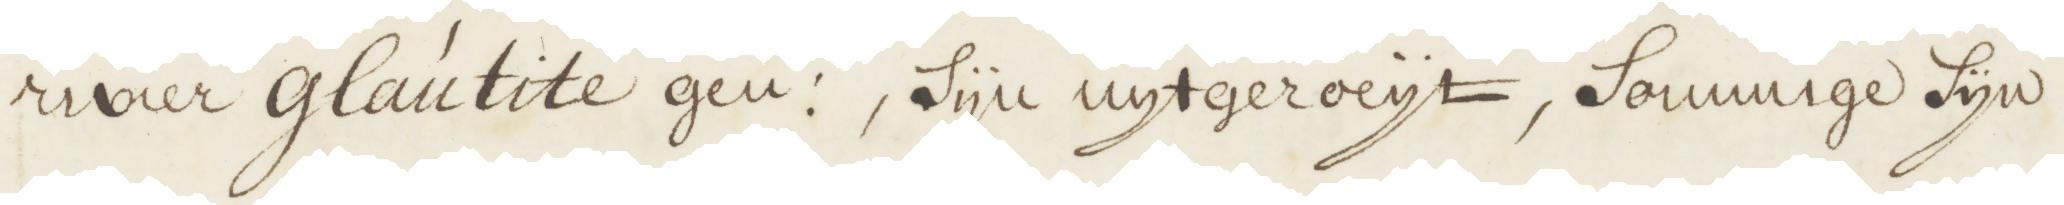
rivier glautite gen:t, sijn uijtgeroeijt, sommige sijn
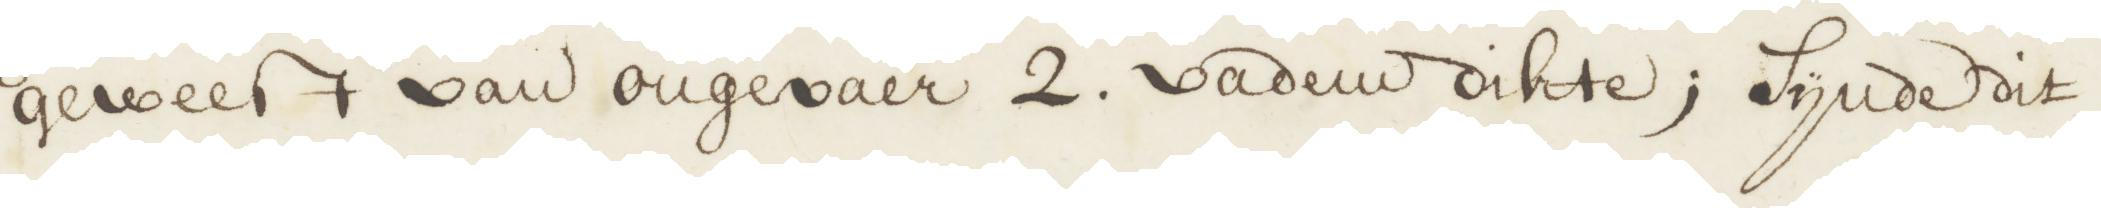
geweest van ongevaer 2. vadem dikte; sijnde dit
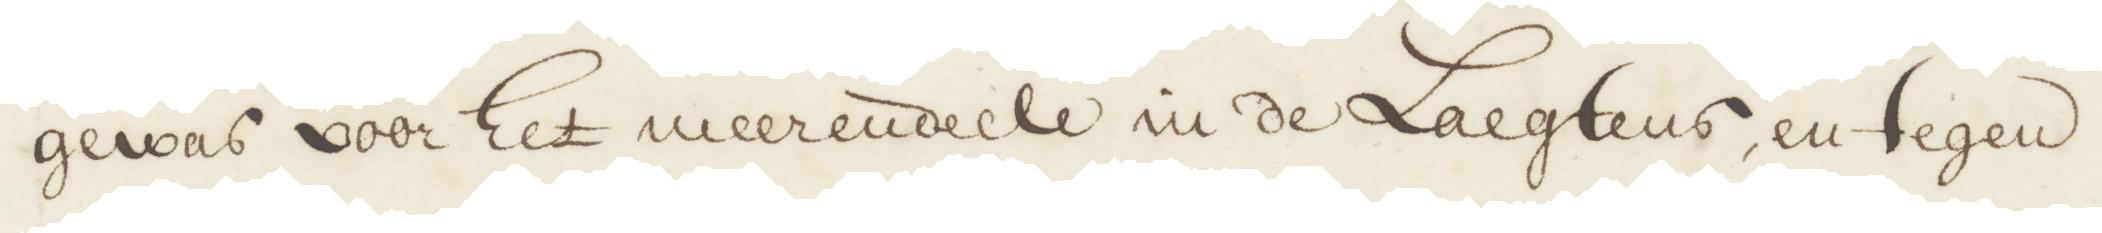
gewas voor het meerendeele in de Laegtens, en tegen
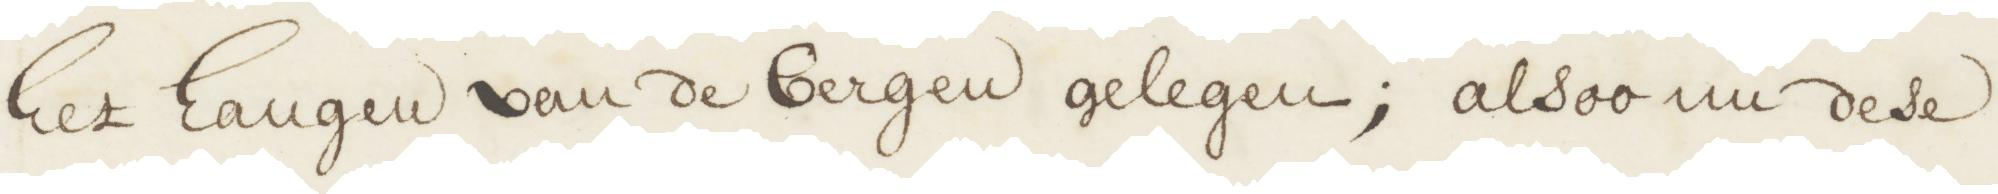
het hangen van de bergen gelegen; alsoo nu dese
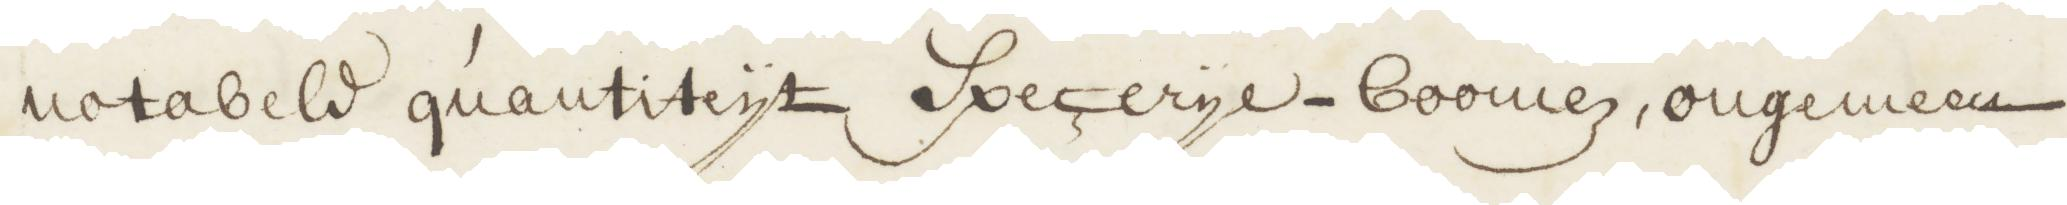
notabele quantiteijt specerije-boomen, ongemeen
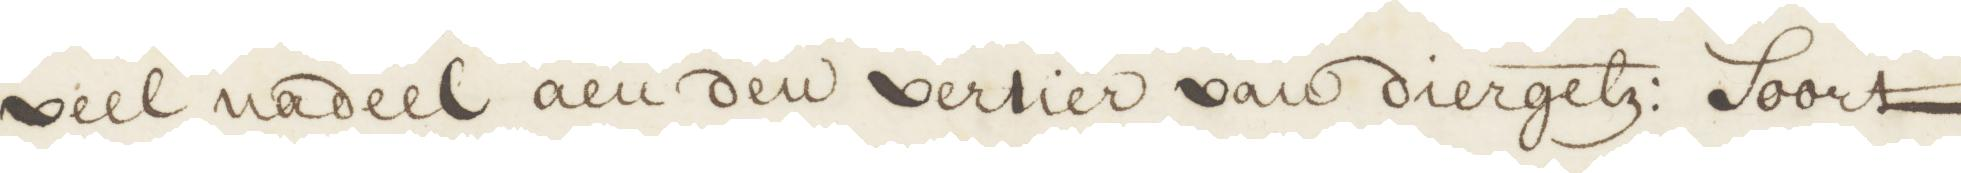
veel nadeel aen den vertier van diergelijk soort
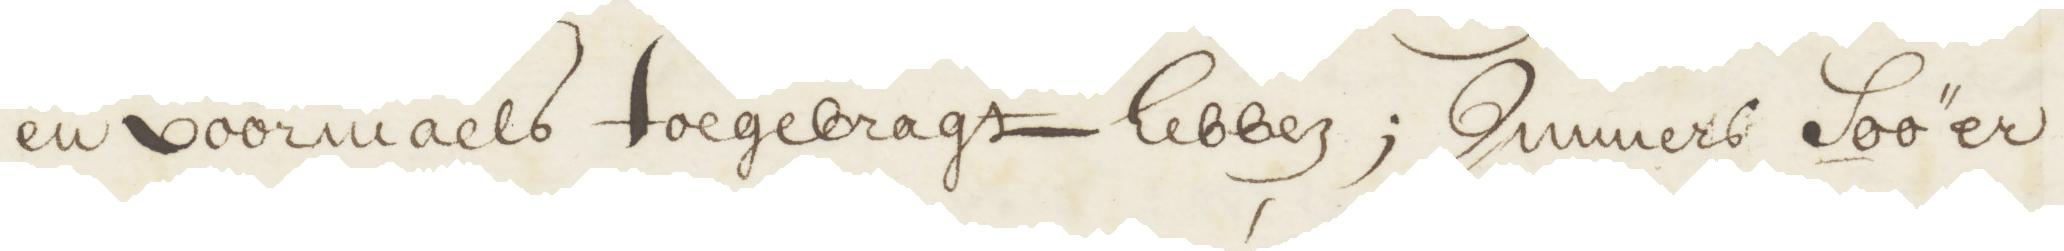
en voormaels toegebragt hebben; Jmmers soo "er
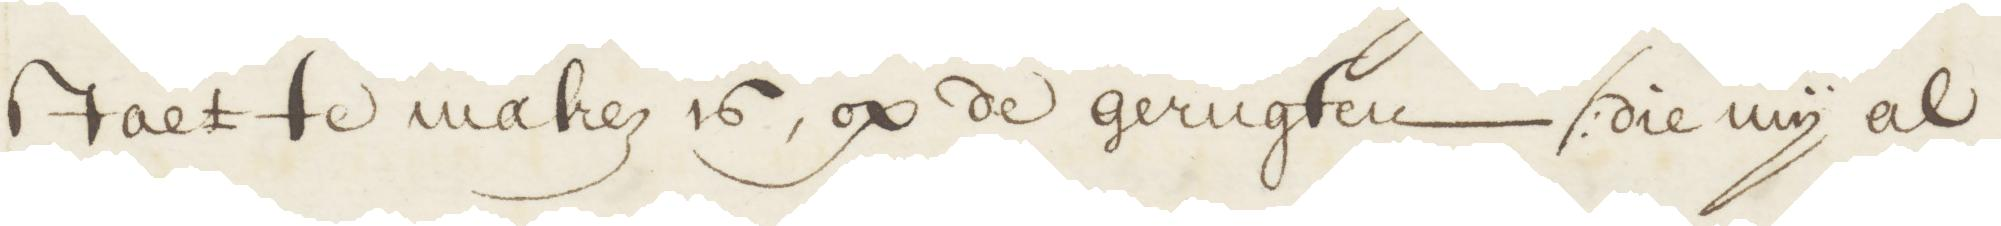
staet te maken is, op de gerugten /:die mij al
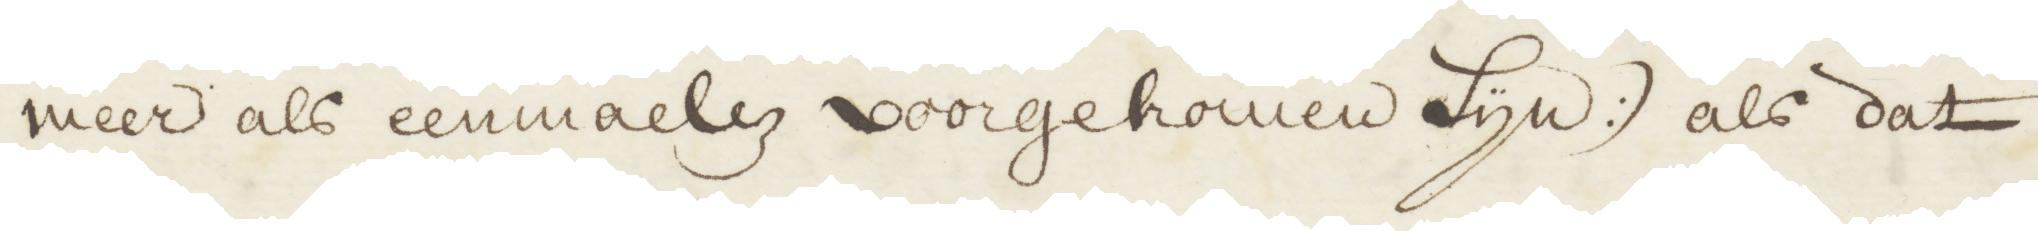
meer als eenmaelen voorgekomen sijn:) als dat
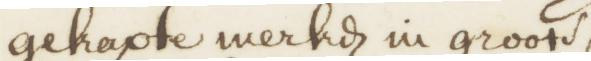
gekapte merken in groote
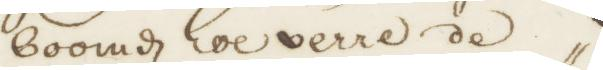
boomen hoe verre de „
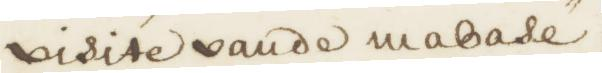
visite vande mabase
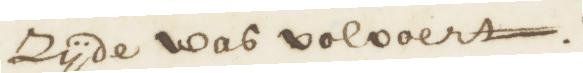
zijde was volvoert.
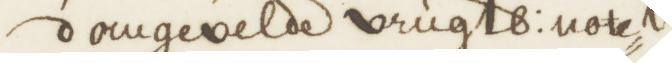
d'omgevelde vrugtb: note„
